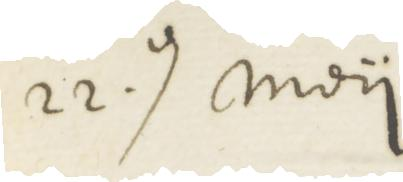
22.en meij
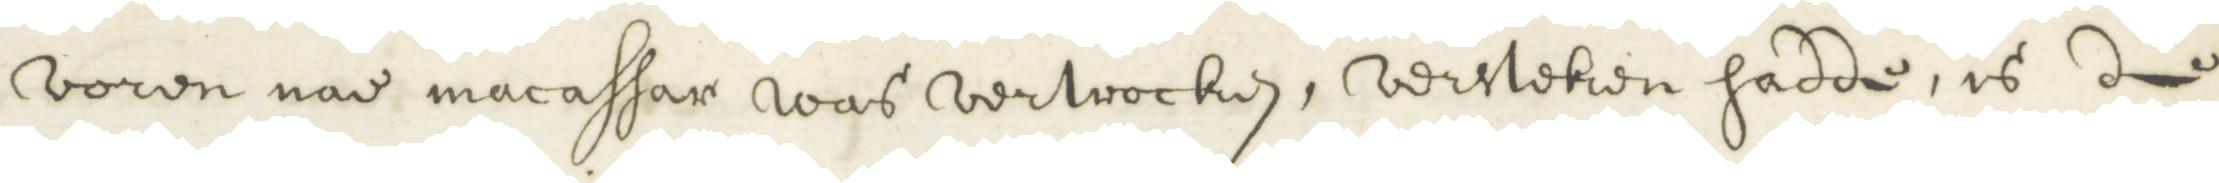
voren nae macassar was vertrocken, versteken hadde, is de
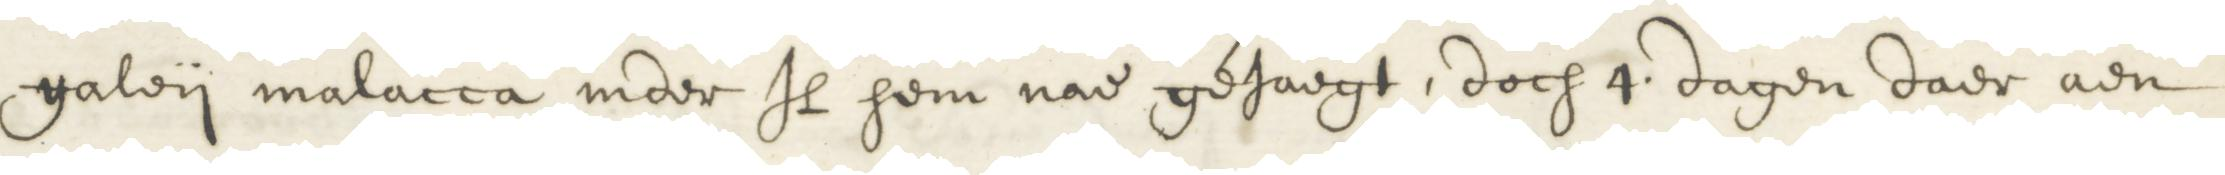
galeij malacca inder il hem nae gejaegt, doch 4. dagen daer aen
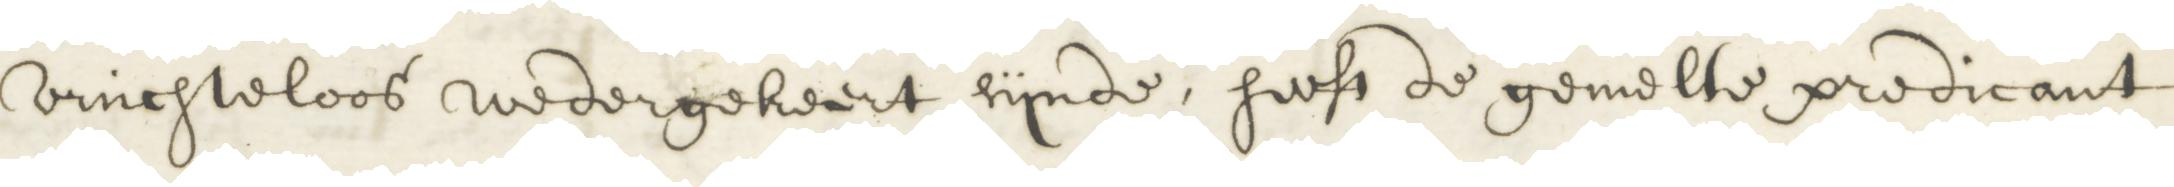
vruchteloos wedergekeert sijnde, heeft de gemelte predicant
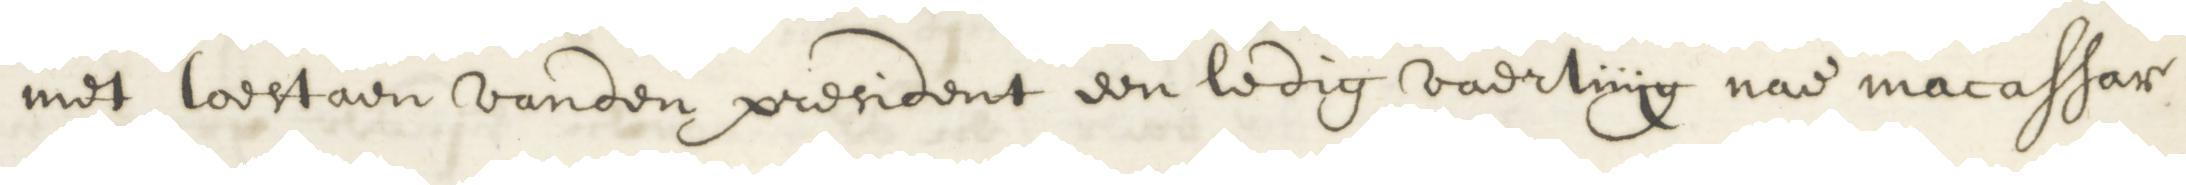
met toestaen vanden president een ledig vaertuijg nae macassar
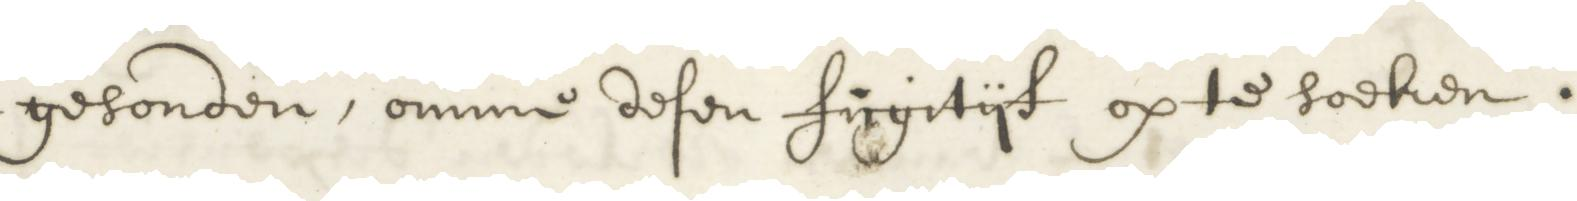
gesonden, omme desen fugitijf op te soeken.
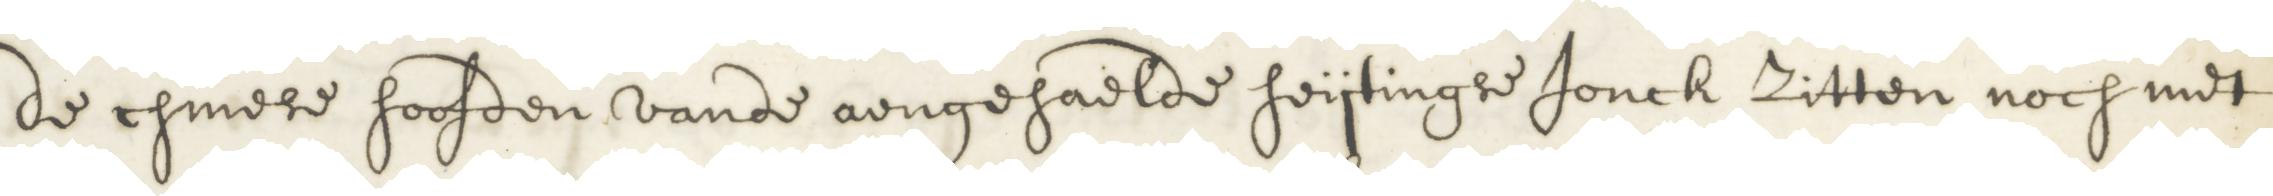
de chinese hoofden vande aengehaelde heijtingse jonck zitten noch met
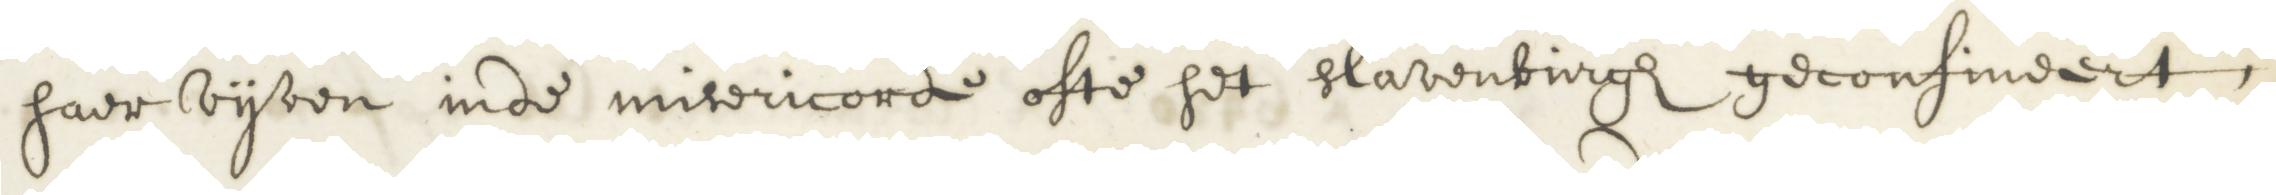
haer vijven inde misericorde ofte het slavenburgh geconfineert,
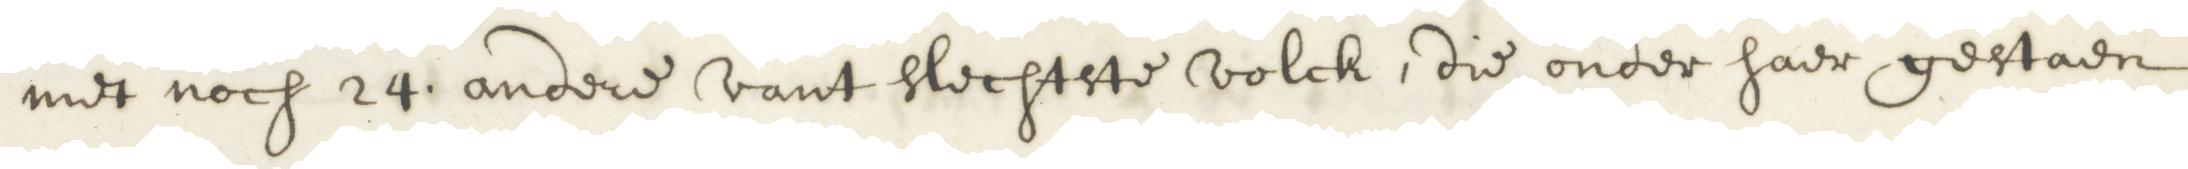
met noch 24. andere vant slechtste volck, die onder haer gestaen
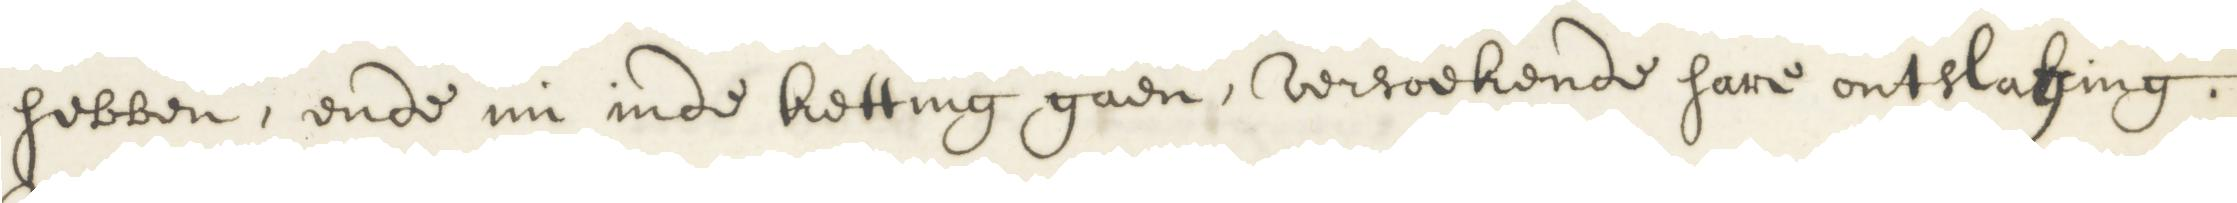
hebben, ende nu inde ketting gaen, versoekende hare ontslaging.
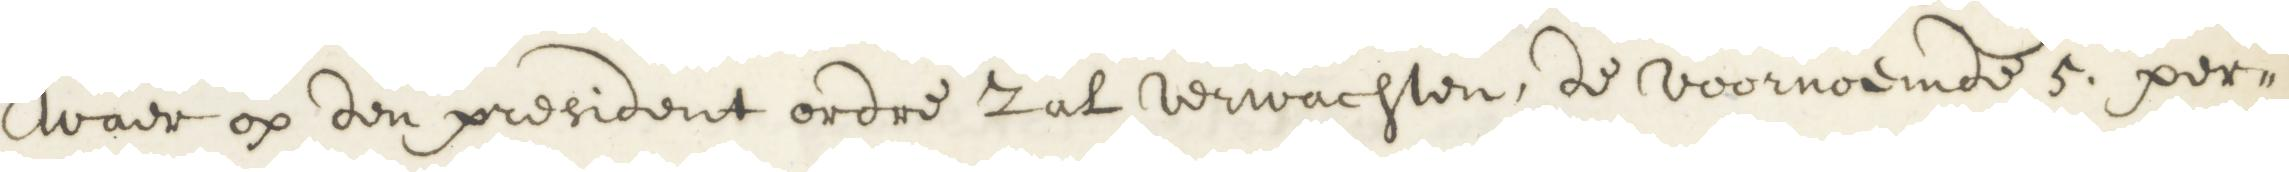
waer op den president ordre zal verwachten, de voornoemde 5. per„
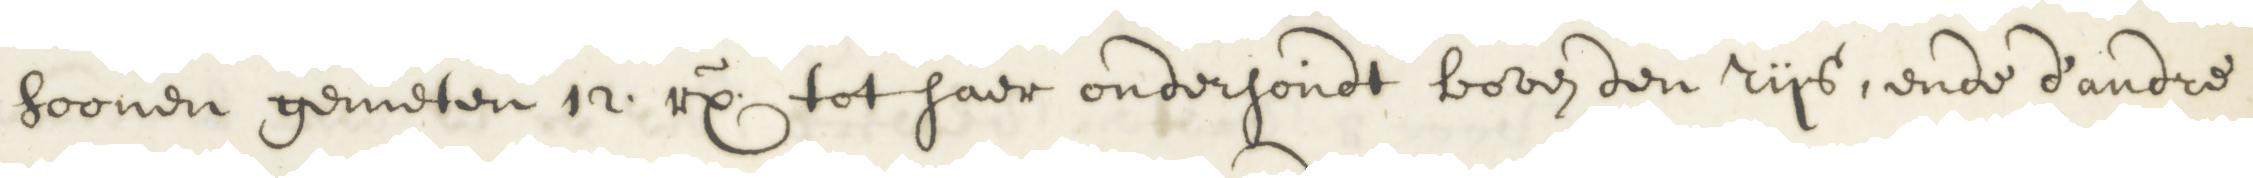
soonen genieten 12. rx. tot haer onderhoudt boven den rijs, ende d’andre
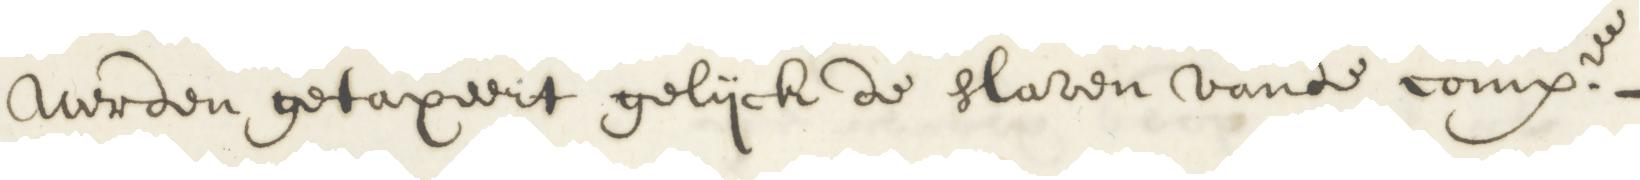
werden getaxeert gelijck de slaven vande comp.e
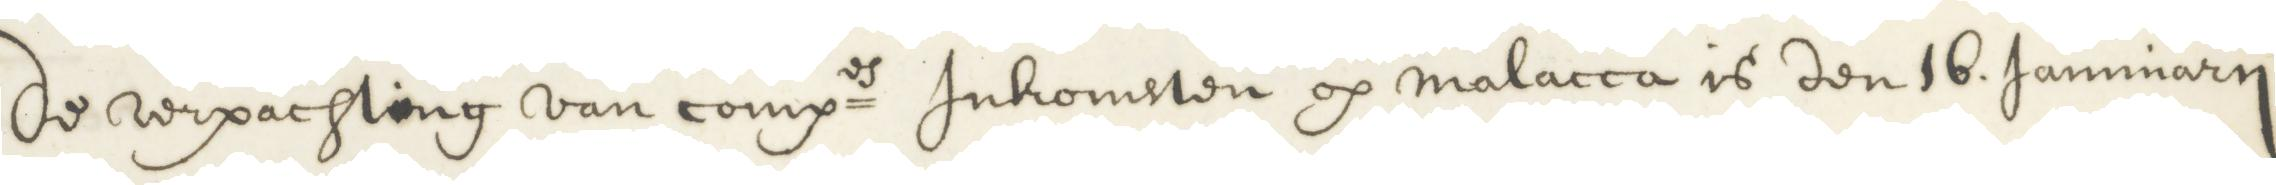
de verpachting van comp=es jnkomsten op malacca is den 16. Jannuarij
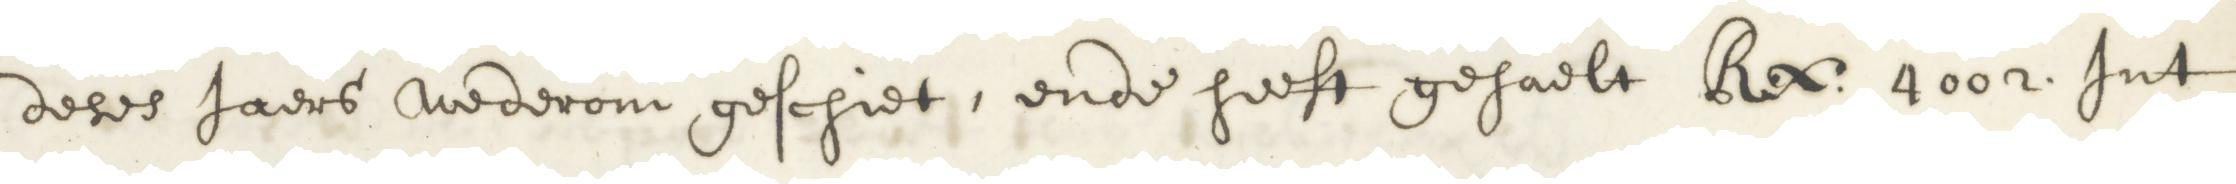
deses jaers wederom geschiet, ende heeft gehaelt Rx: 4002. jnt
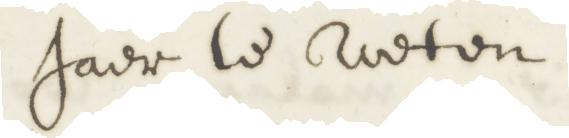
jaer te weten
